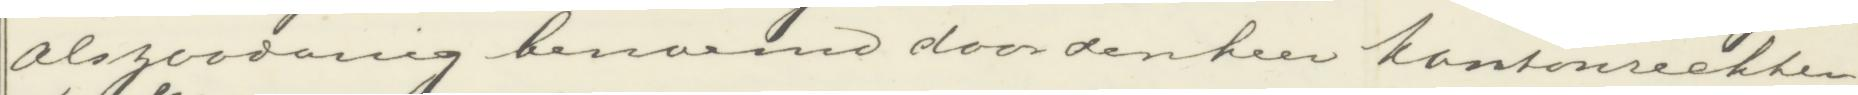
als zoodanig benoemd door den heer kantonrechter
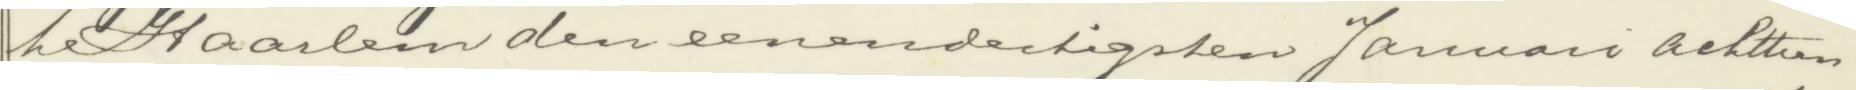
te Haarlem den eenendertigsten Januari achttien
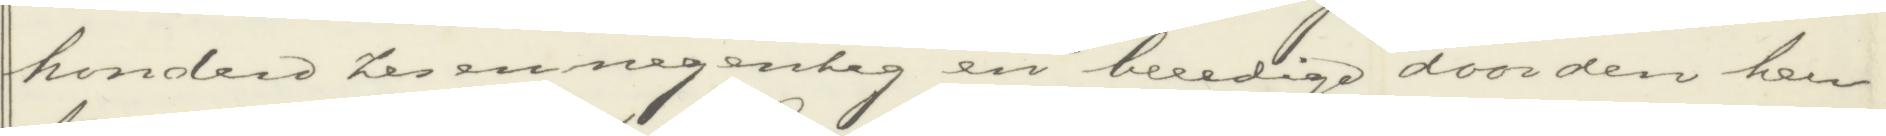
honderd zes en negentig en beeedigd door den heer
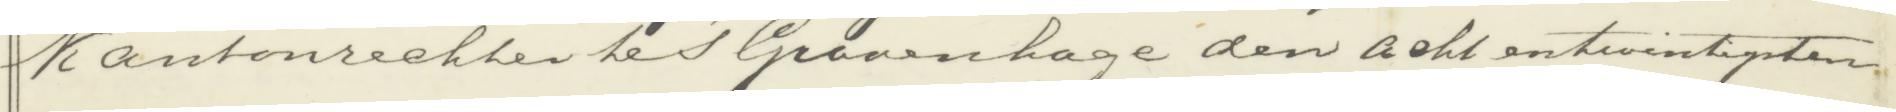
Kantonrechter te 's Gravenhage den acht entwintigsten
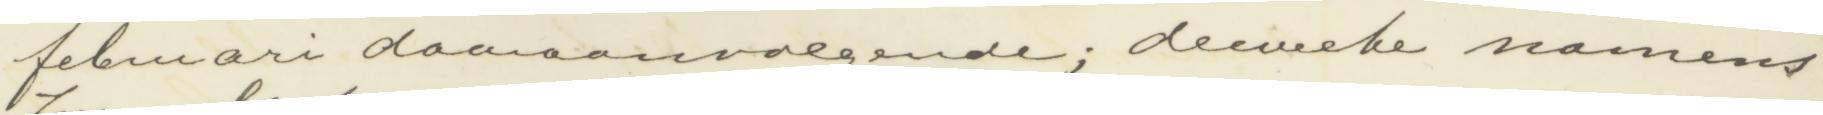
februari daaraanvolgende; dewelke namens
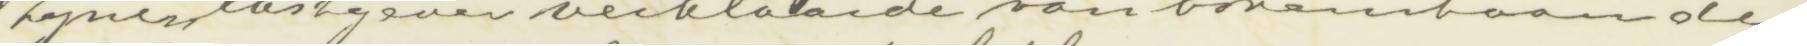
zynen lastgever verklaarde van bovenstaande
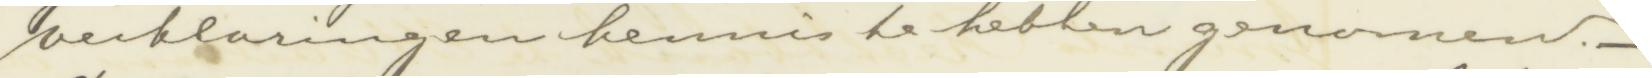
verklaringen kennis te hebben genomen.—
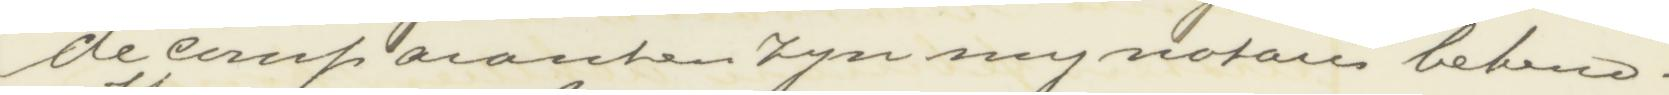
de comparanten zyn my notaris bekend
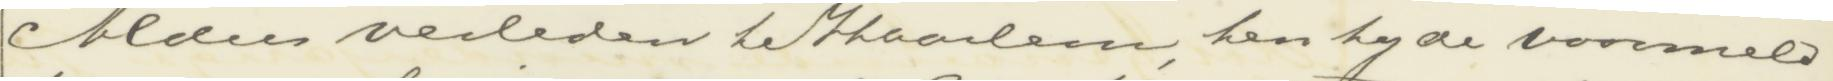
Aldus verleden te Haarlem, ten tyde voormeld
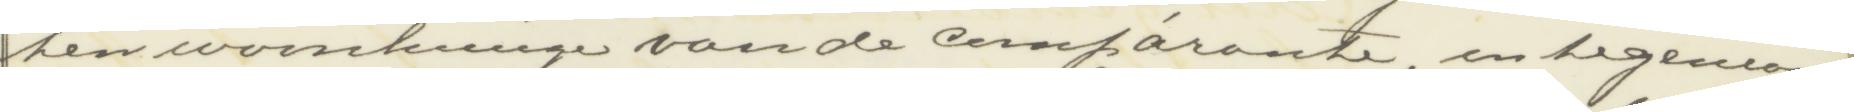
ten woonhuize van de comparante, in tegenwoor
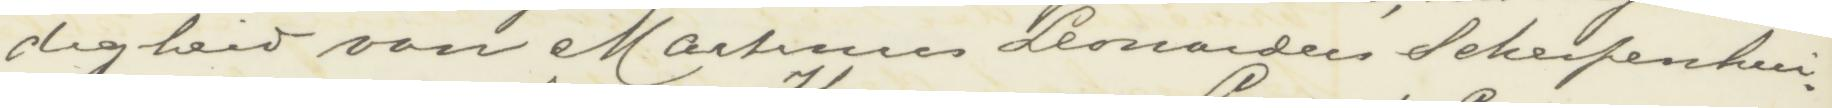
digheid van Martinus Leonardus Scherpenhui„
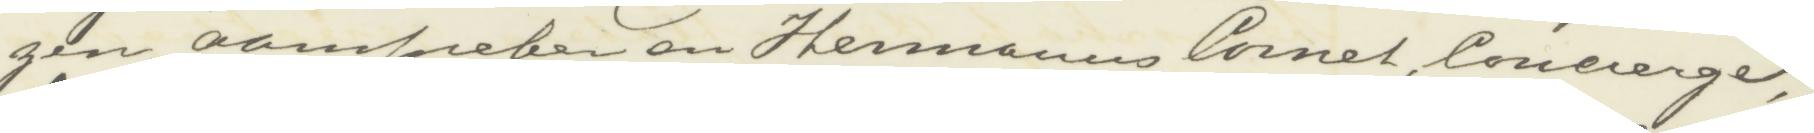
zen, aanspreker en Hermanus Cornet, Concierge,
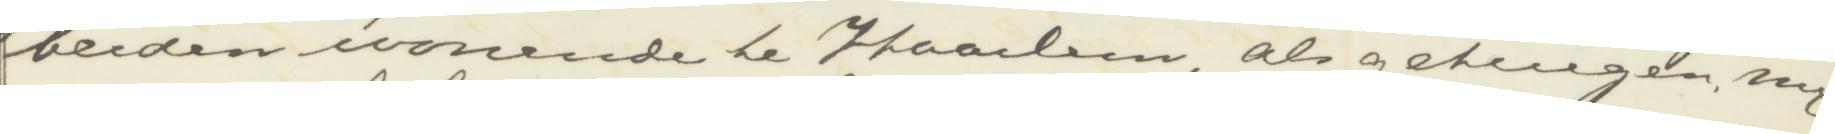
beiden wonende te Haarlem, als getuigen, my
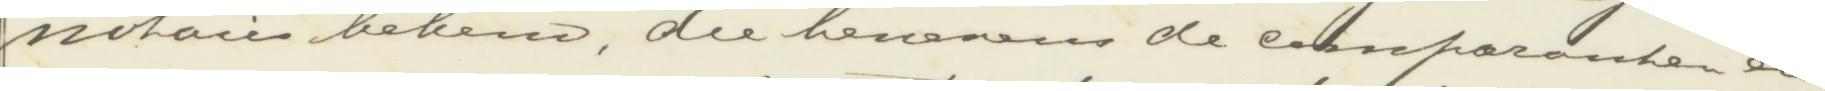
notaris bekend, die benevens de comparanten en
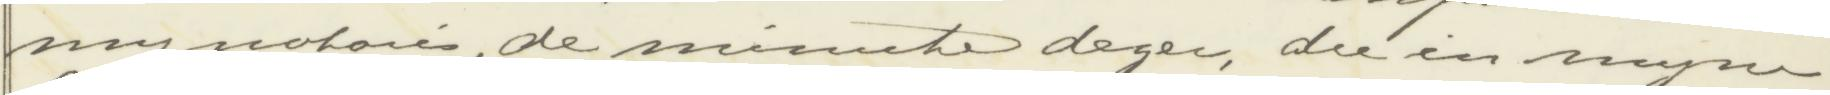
my notaris, de minute dezer, die in myne
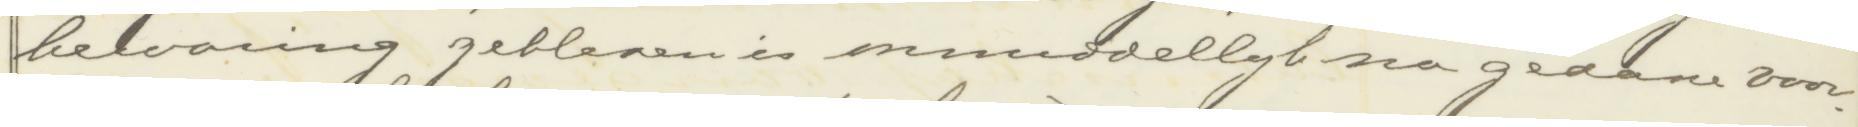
bewaring gebleven is onmiddellyk na gedane voor„
